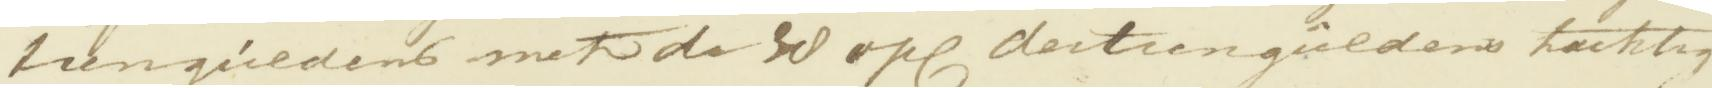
tien guldens met de 38 opC dertien guldens tachtig
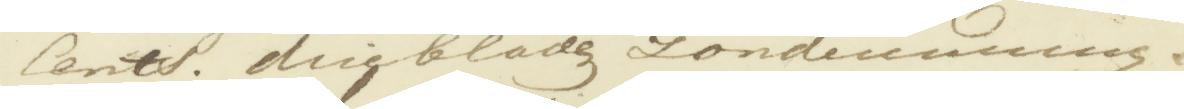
Cents. drie bladen zonderrenvoien
